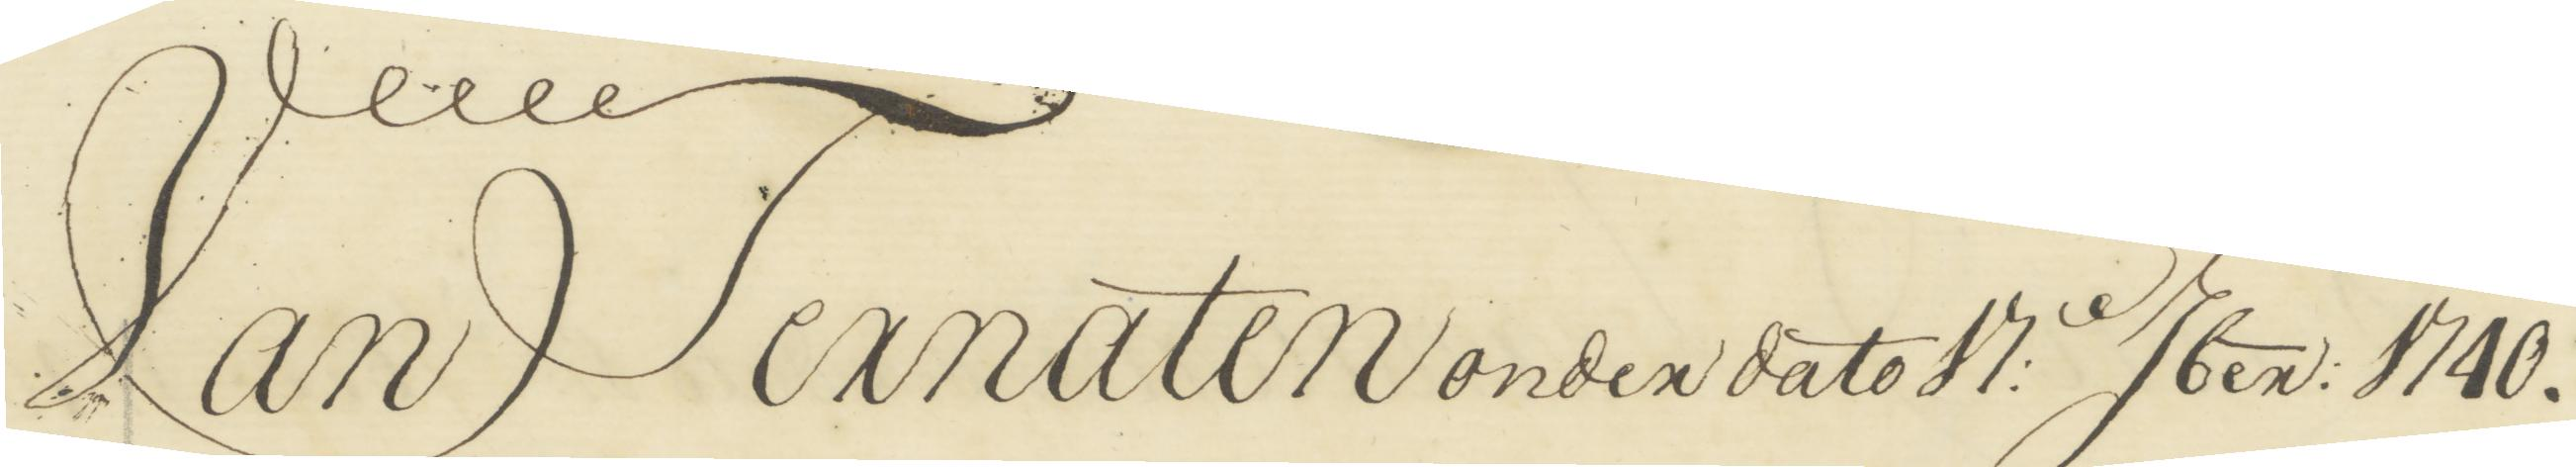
Van Ternaten onder dato 17:e Jber: 1740.
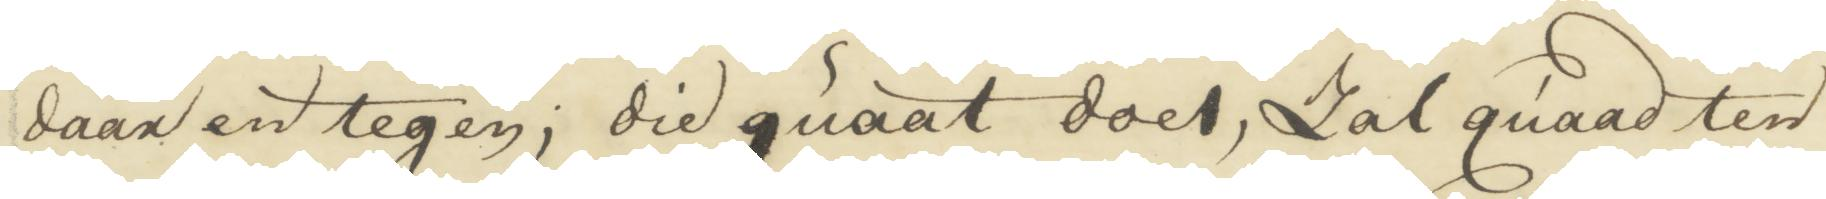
daar en tegen; die quaat doet, zal quaad ten
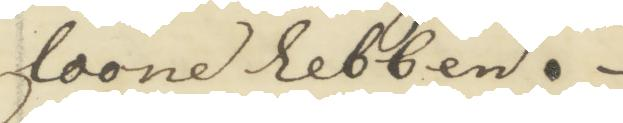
loone hebben.
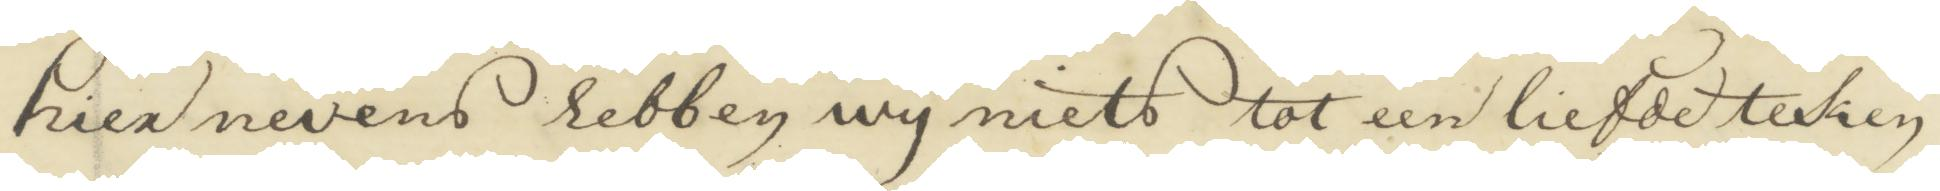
hier nevens hebben wij niets tot een liefde teken
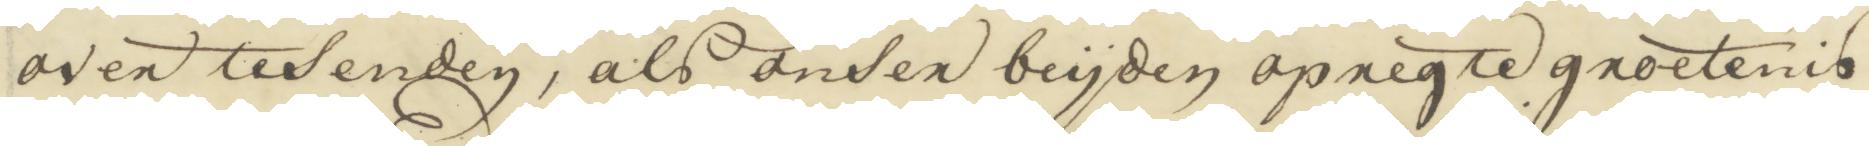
over tesenden, als onser beijden opregte groetenis
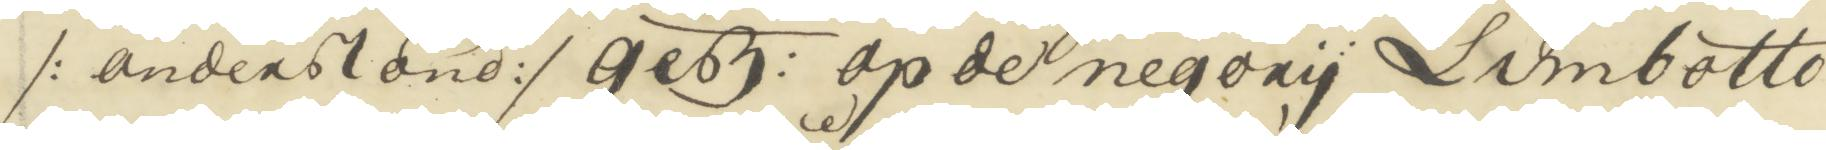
/:onderstond:/ gesz: op de negorij Limbotto
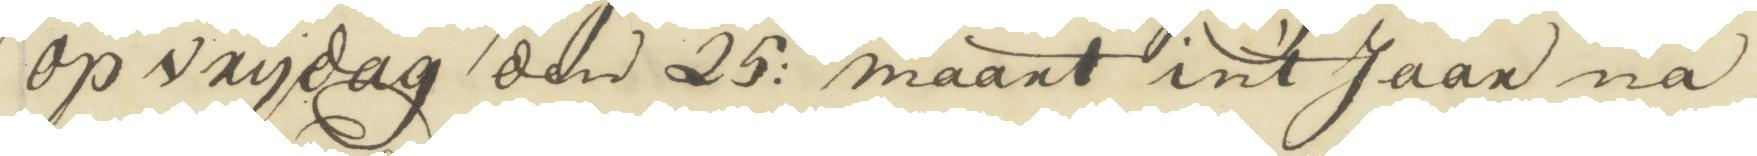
op vrijdag den 25:e maart in’t Jaar na
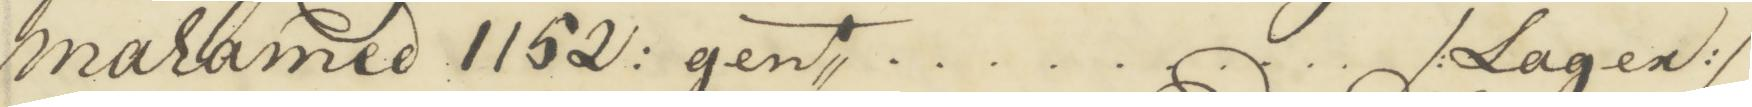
mahamed 1152: gen„t . . . . . . . . . . /:Lager:/
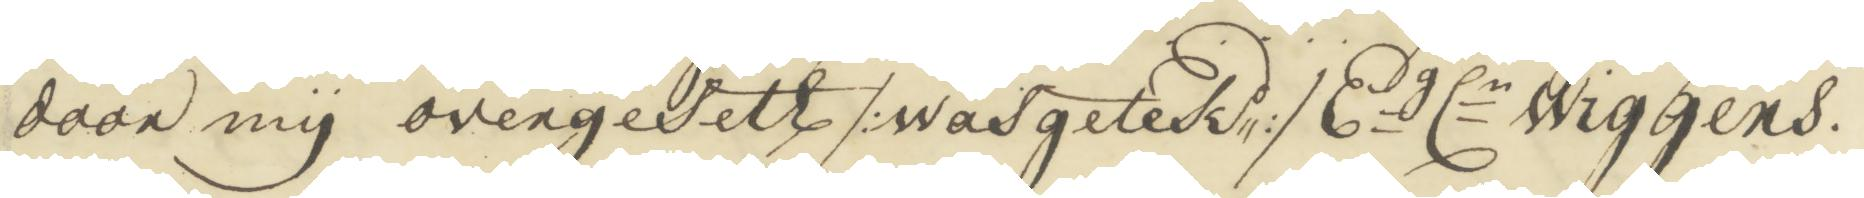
door mij overgeseth /:was getek„d:/ E=g C=n Wiggers.
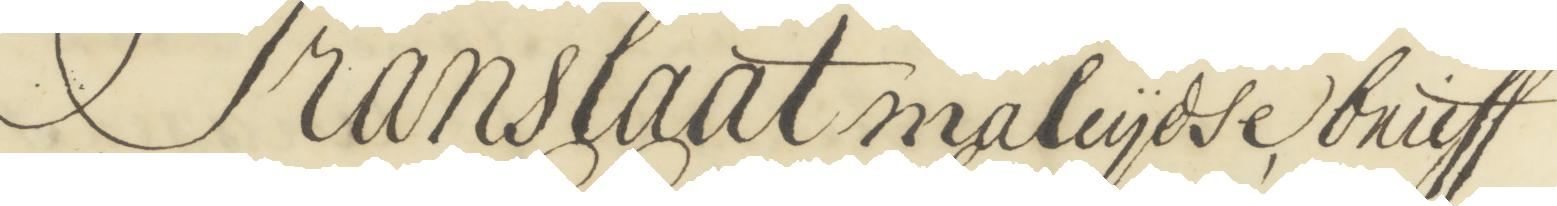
Translaat maleijdse brieff
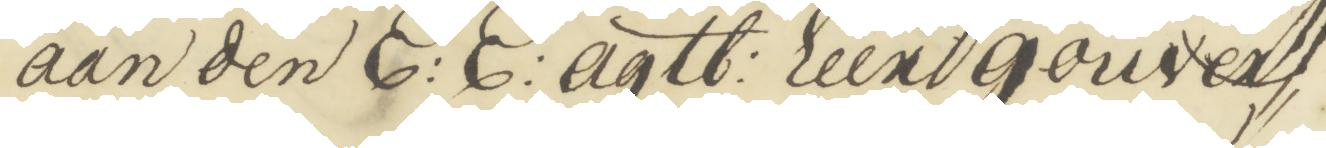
aan den E: E: agtb: heer gouver„
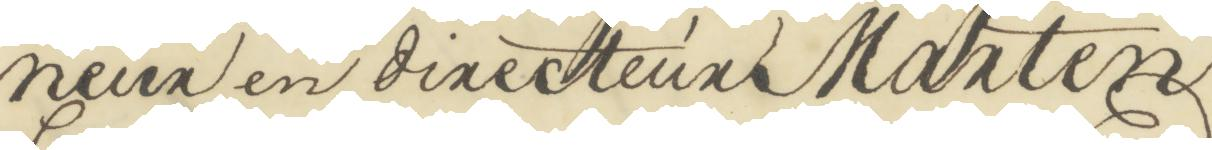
neur en directeur Marten
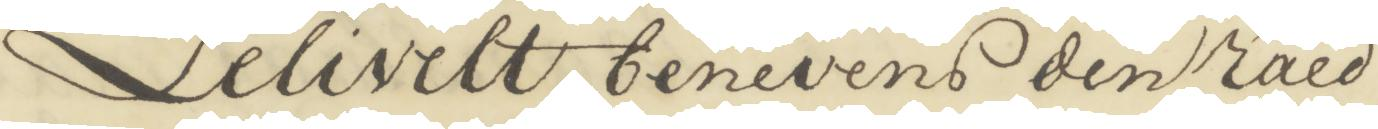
Lelivelt, benevens den raed
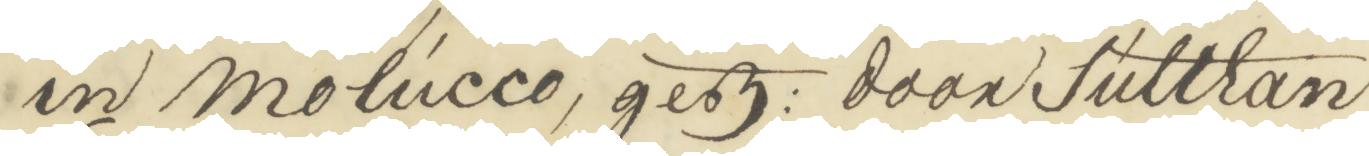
in molucco, gesz: door sulthan
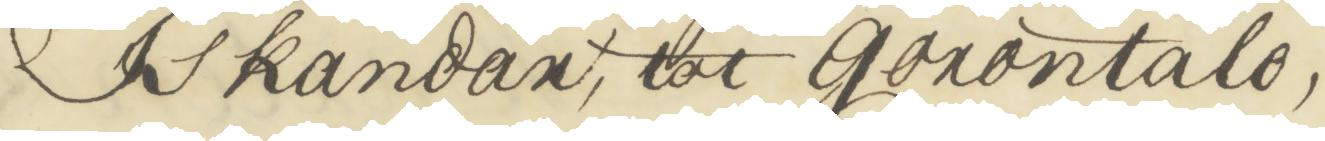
Iskandar, tot Gorontalo
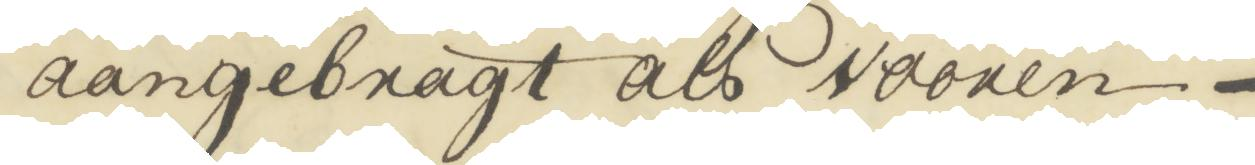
aangebragt als vooren —
